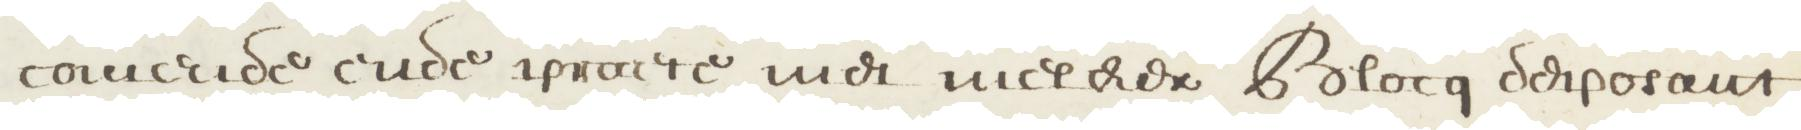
comende ende tpraete met melcher Blocq deposant
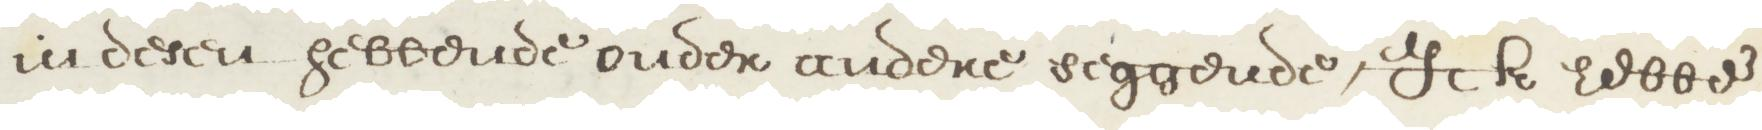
in desen hebbende onder andere seggende, Jck hebbe
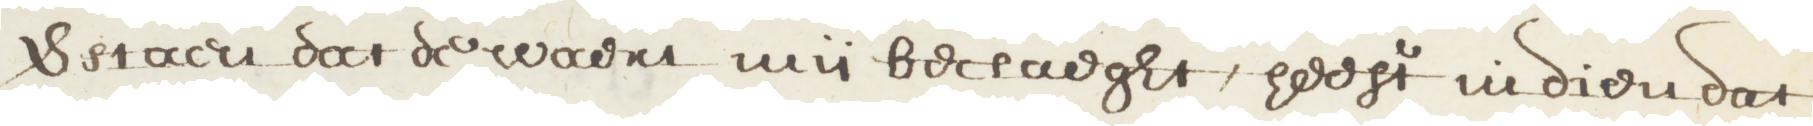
verstaen dat de waert mij beclaeght, heeft in dien dat
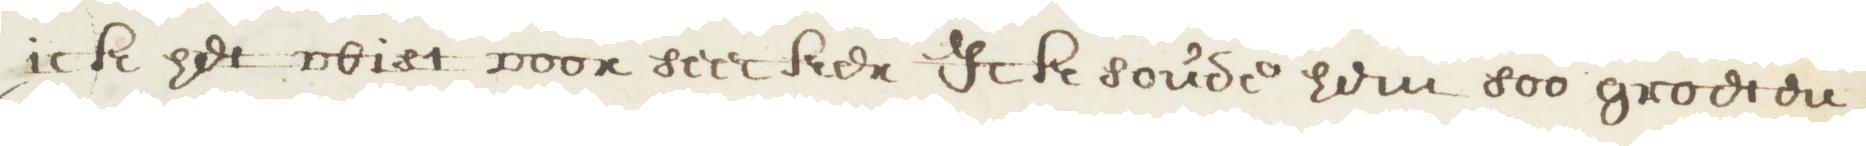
ick het wist voor seecker Jck soude hem soo groeten,
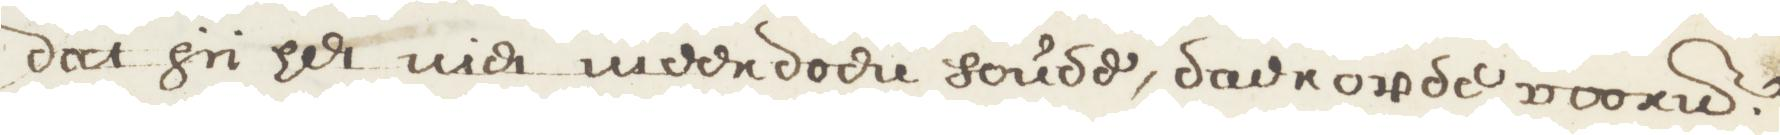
dat hij het niet meer doen soude, daer op de voorn.
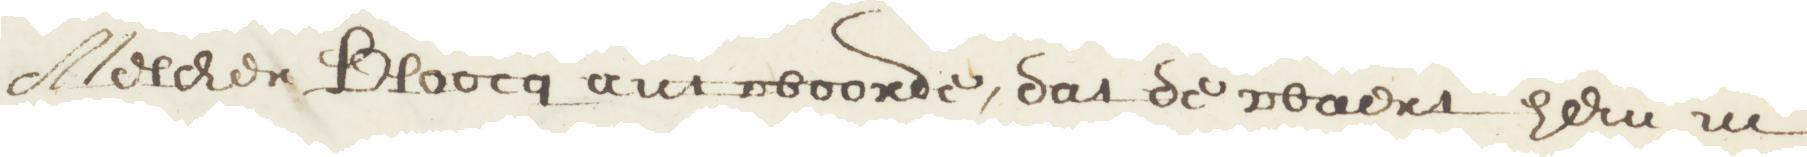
Melcher Bloocq antwoorde, dat de waert hem in
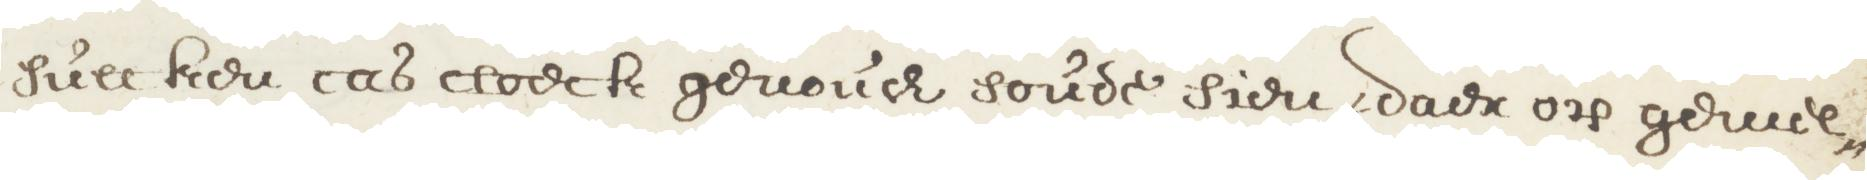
sulcken cas cloeck genouch soude sien, daer op gemel„
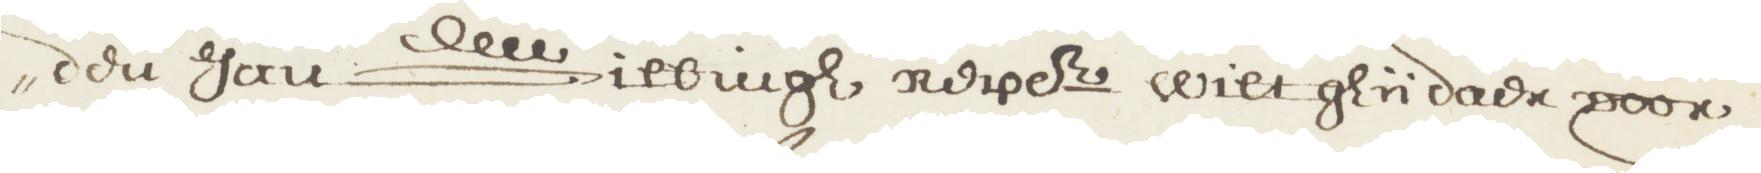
„den Jan Gilbingh repl=r wilt ghij daer voor
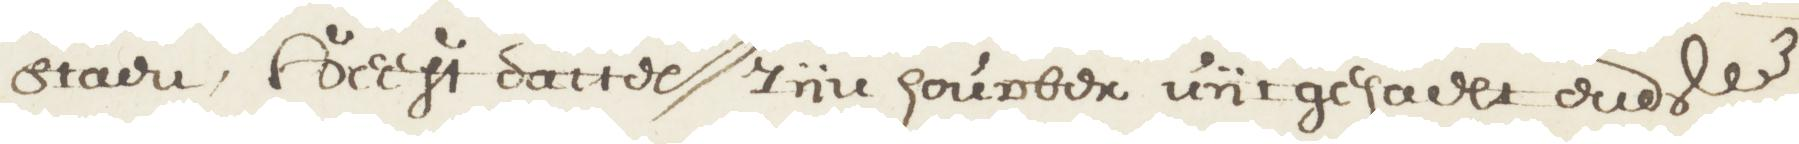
staen, heeft dattelijk zijn houwer uijtgehaelt ende
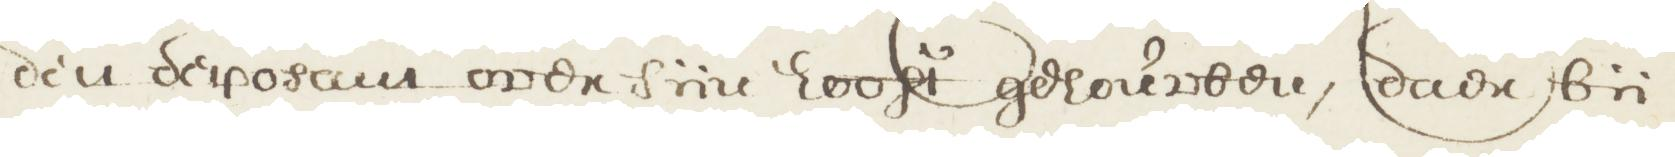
den deposant over sijn hooft gehouwen, daer bij
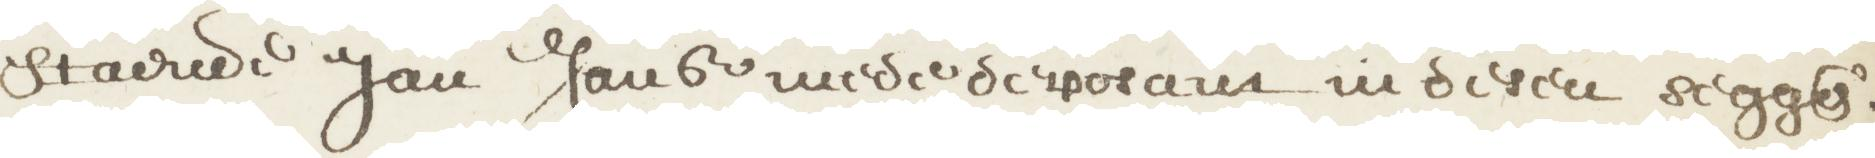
staende Jan Jans mede deposant in desen seggende
